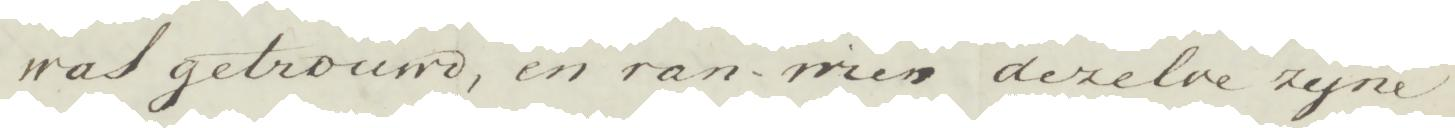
was getrouwd, en van - wien dezelve zyne
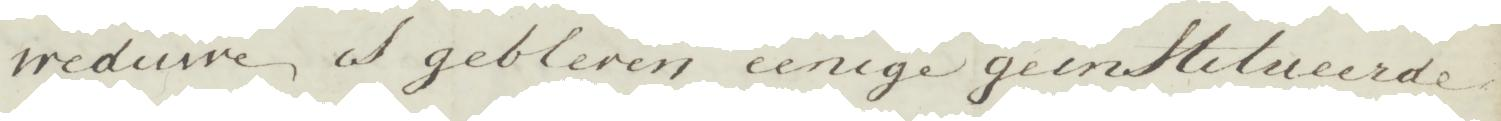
weduwe is gebleven eenige geinstitueerde
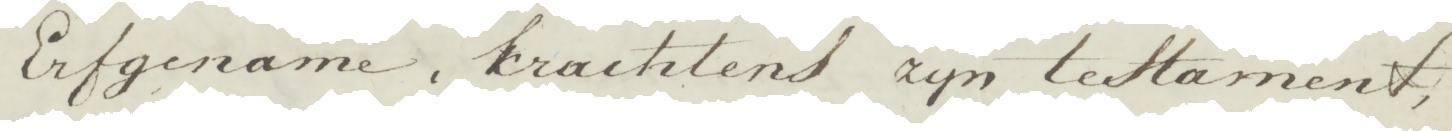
Erfgename, krachtens zyn testament,
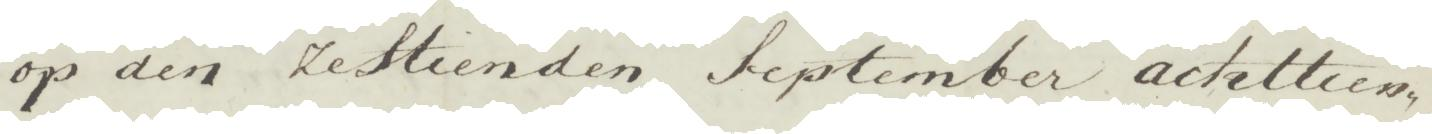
op den zestienden september achttien„
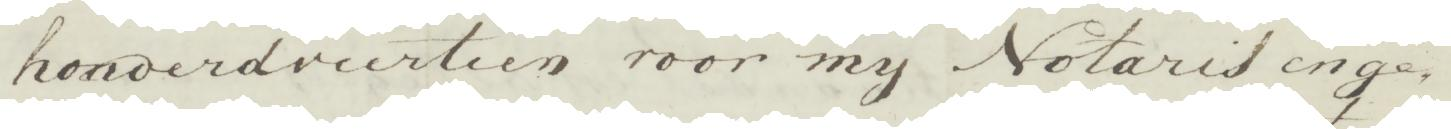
honderdveertien voor my Notaris en ge„
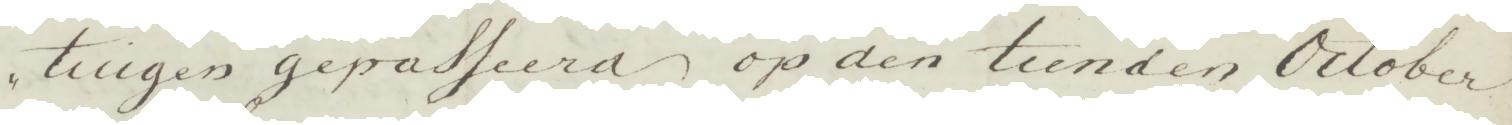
„tuigen gepasseerd, op den tienden October
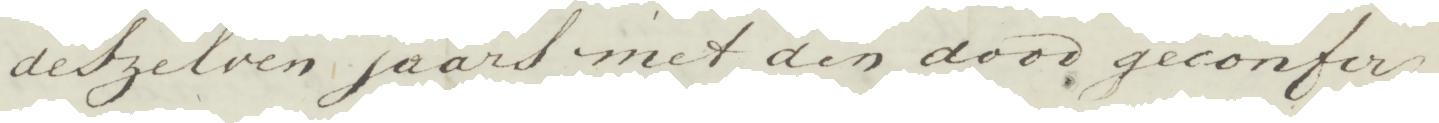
deszelven jaars met den dood geconfir
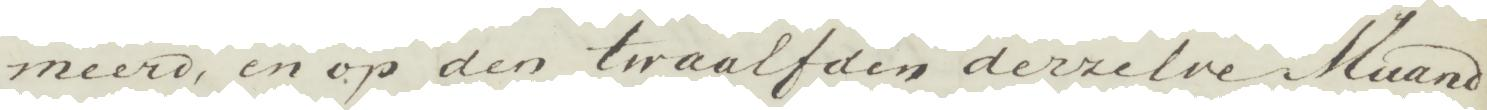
meerd, en op den twaalfden derzelve Maand
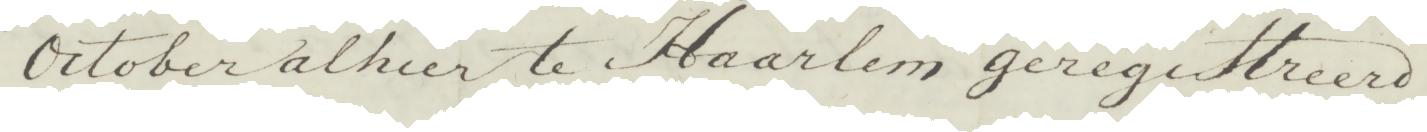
October alhier te Haarlem geregistreerd
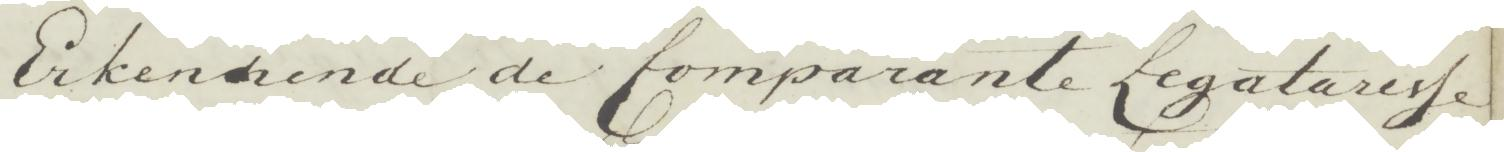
Erkennende de Comparante Legatarisse
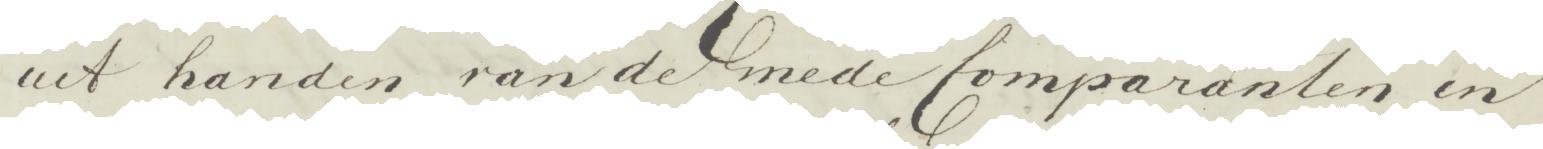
uit handen van de mede Comparanten in
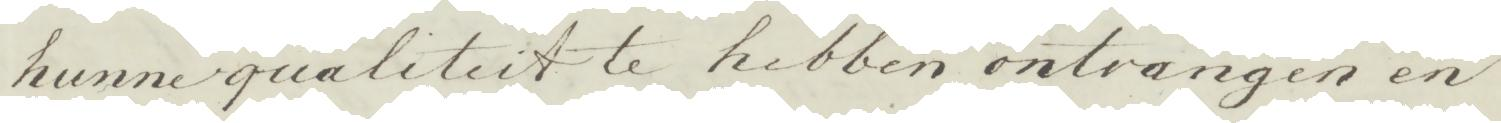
hunne qualiteit te hebben ontvangen en
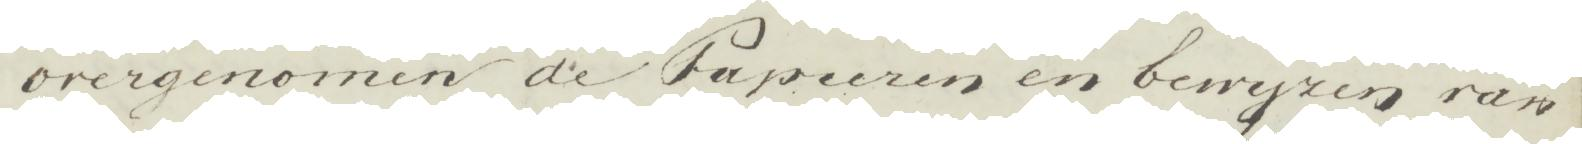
overgenomen de Papieren en bewyzen van
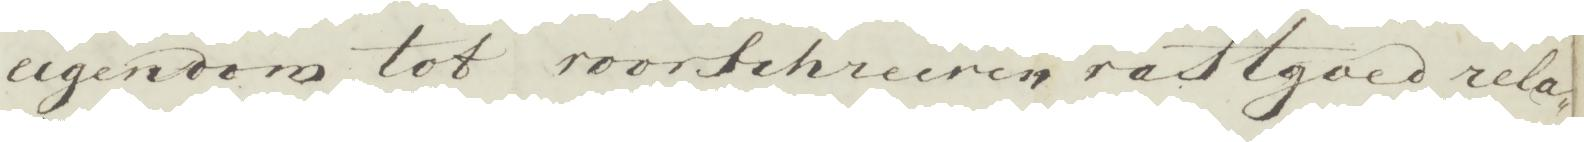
eigendom tot voorschreeven vastgoed rela„
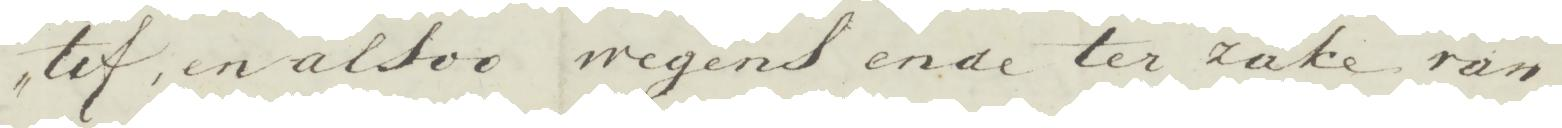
„tif, en alsoo wegens ende ter zake van
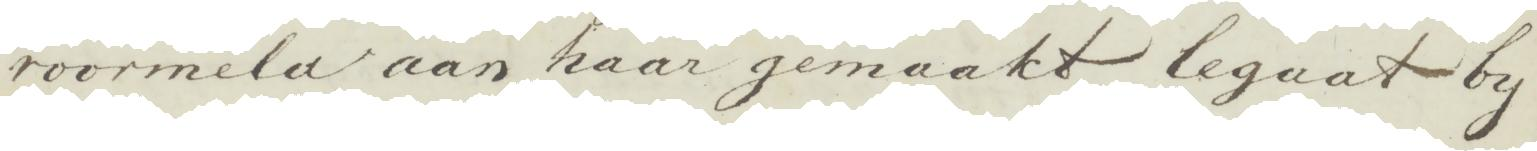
voormeld aan haar gemaakt legaat by
